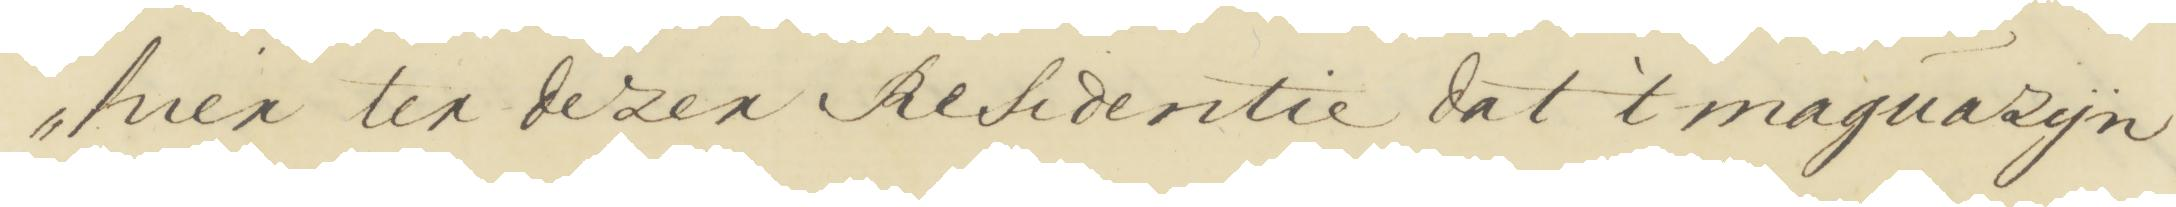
„hier ter dezer Residentie dat ’t maguazijn
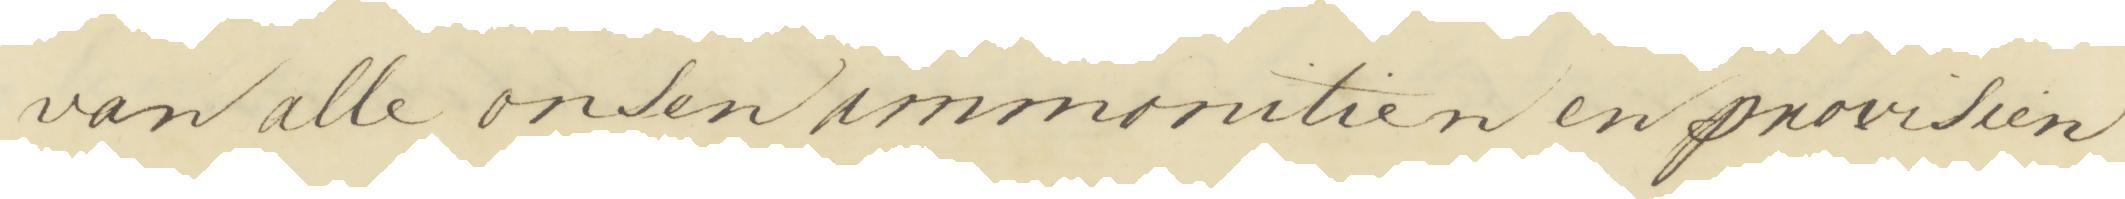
van alle onsen ammonitien en provisien
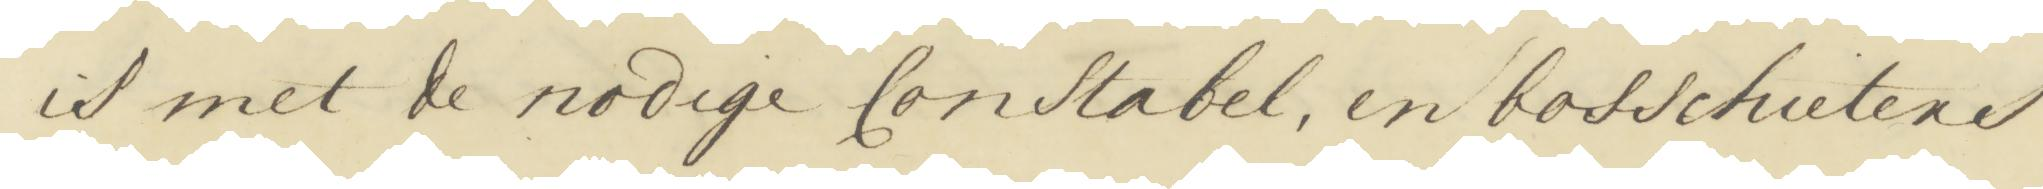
is met de nodige Constabel, en bosschieters
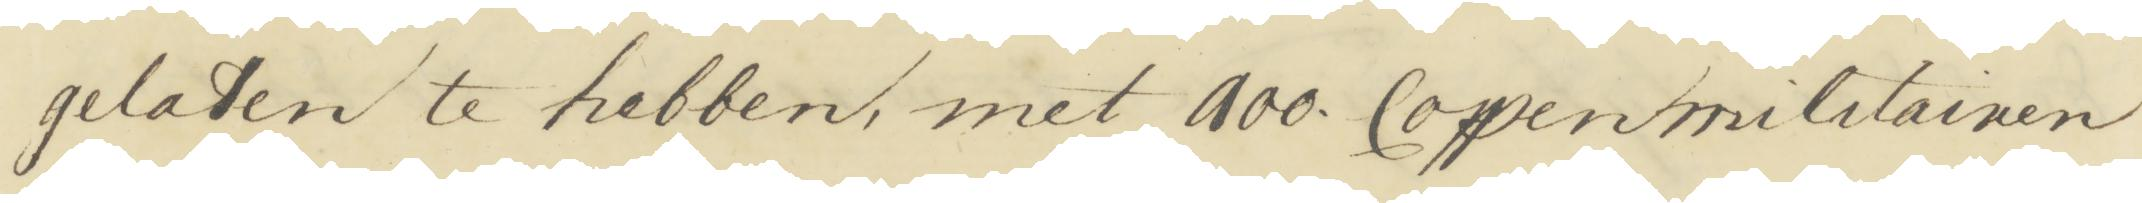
geladen te hebben, met 400. Coppen militairen
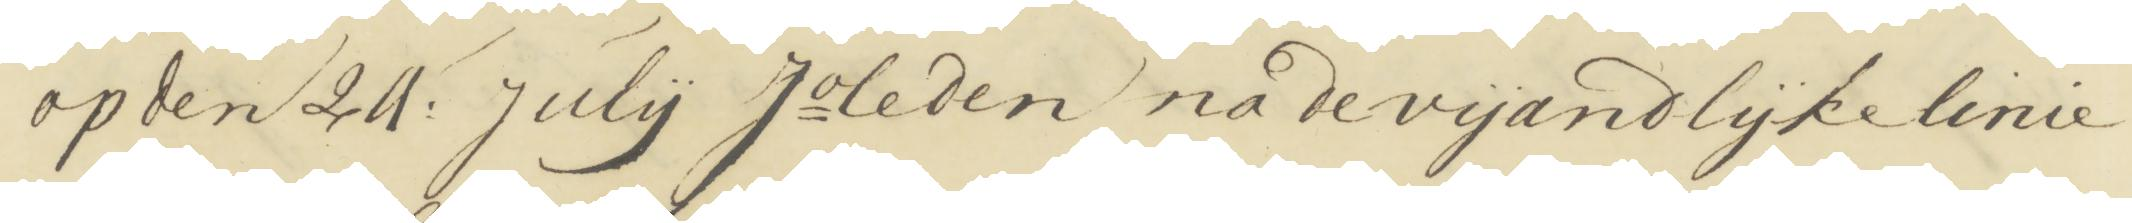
op den 24:' Julij J=oleden na de vijandlijke linie
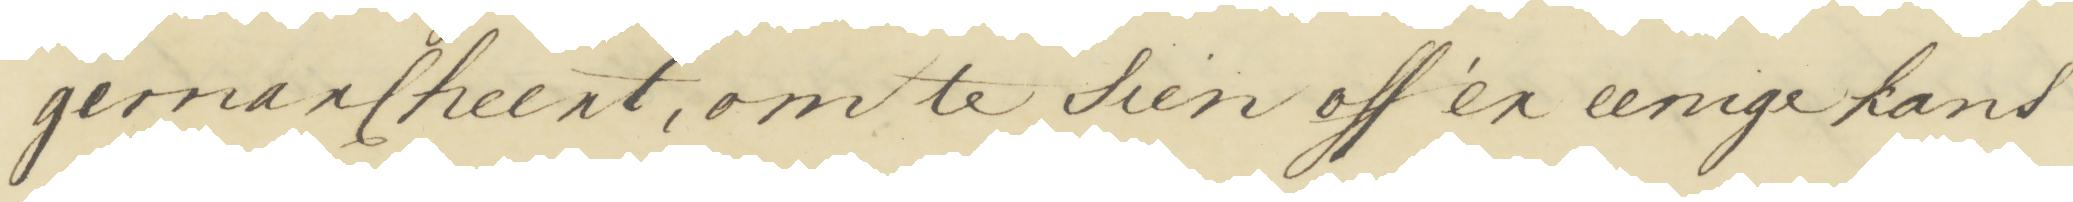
gemarcheert, om te sien off 'er eenige kans
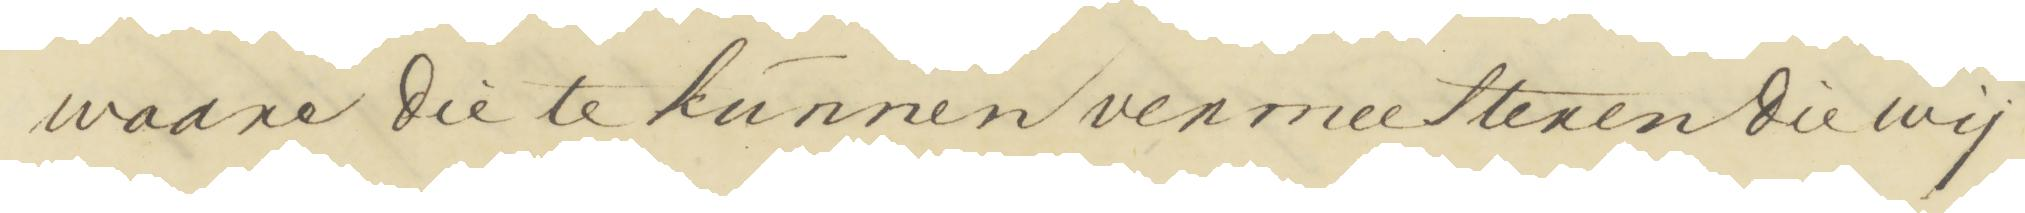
waare die te kunnen vermeesteren die wij
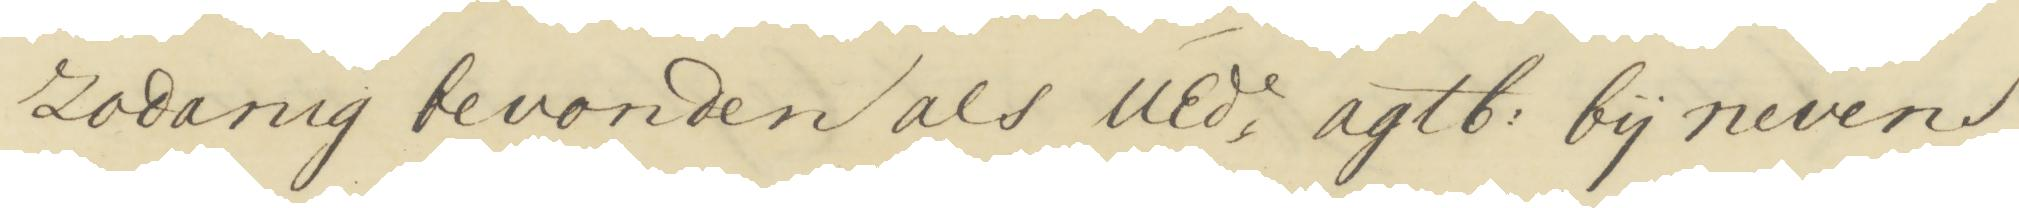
zodanig bevonden als UEd„e agtb: bij nevens
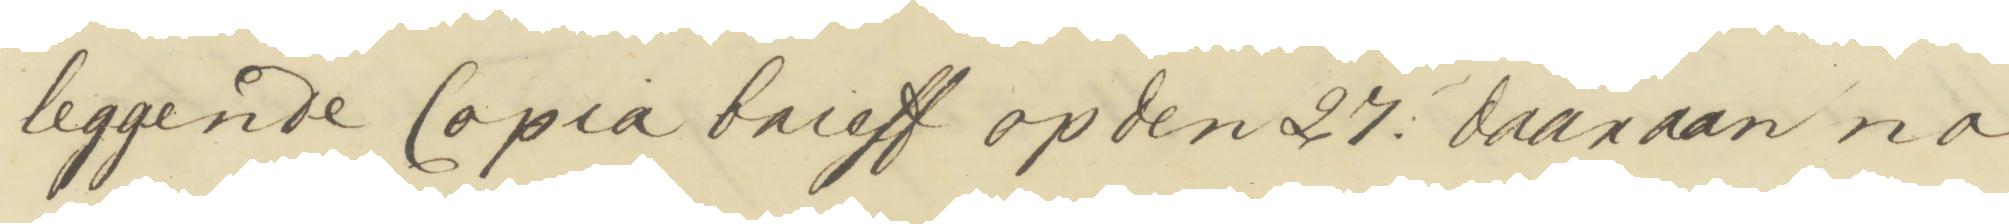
leggende Copia brieff op den 27:' daaraan na
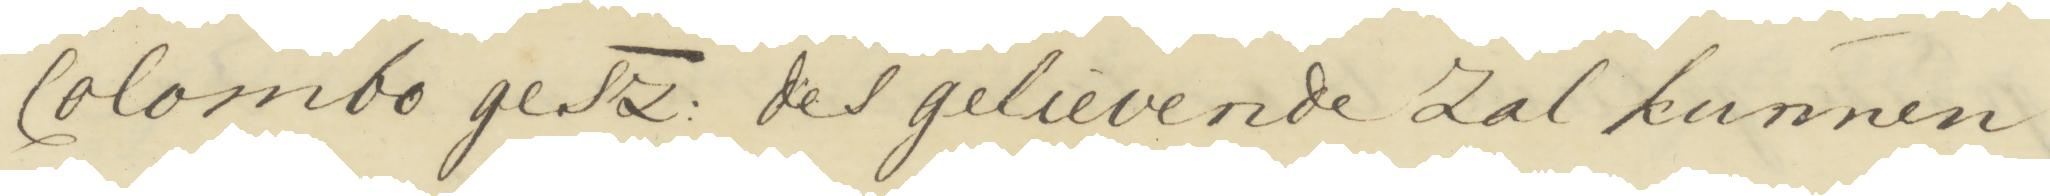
Colombo gesz: des gelievende zal kunnen
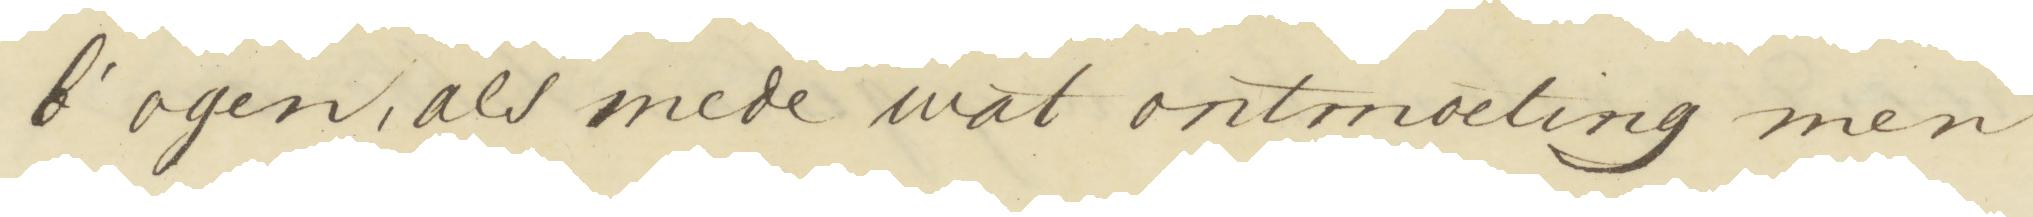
b'ogen, als mede wat ontmoeting men
